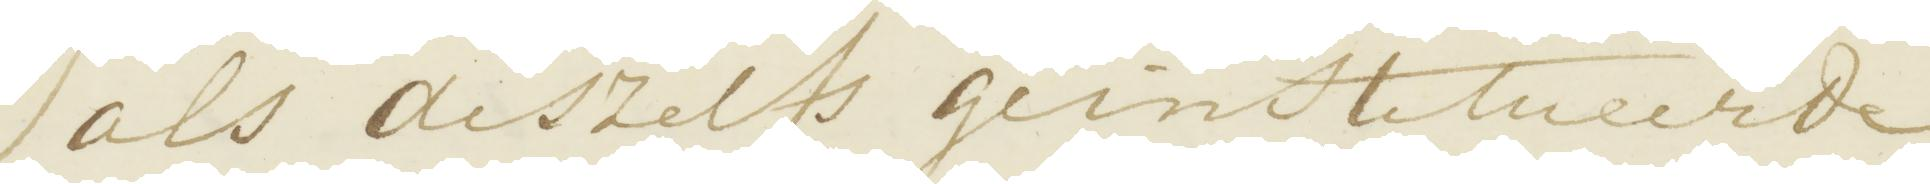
als deszelfs geinstitueerde
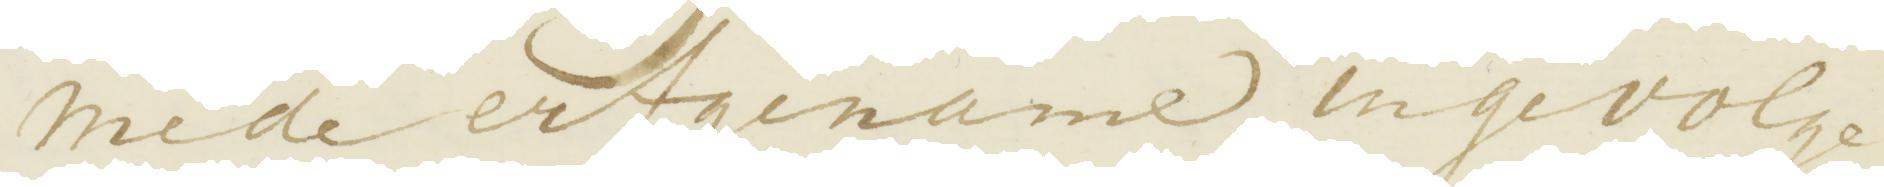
mede erfgename ingevolge
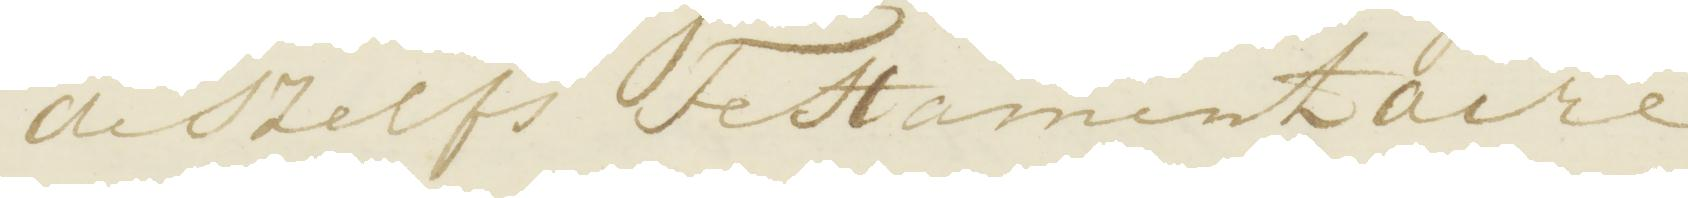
des Zelfs Testamentaire
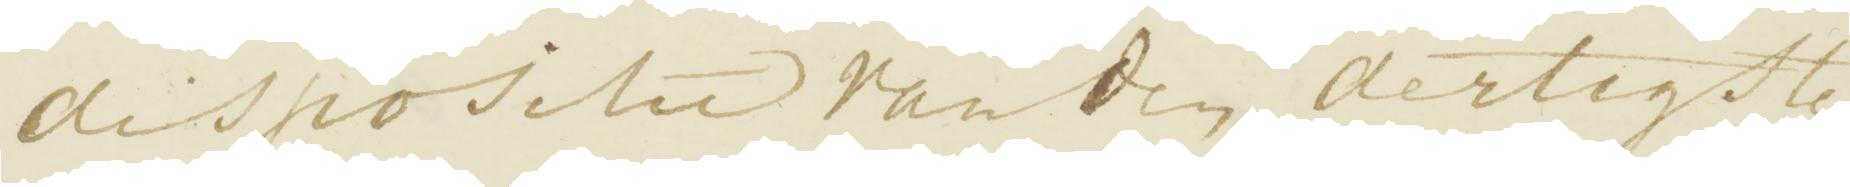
dispositie van den dertigste
